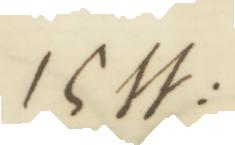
1511:
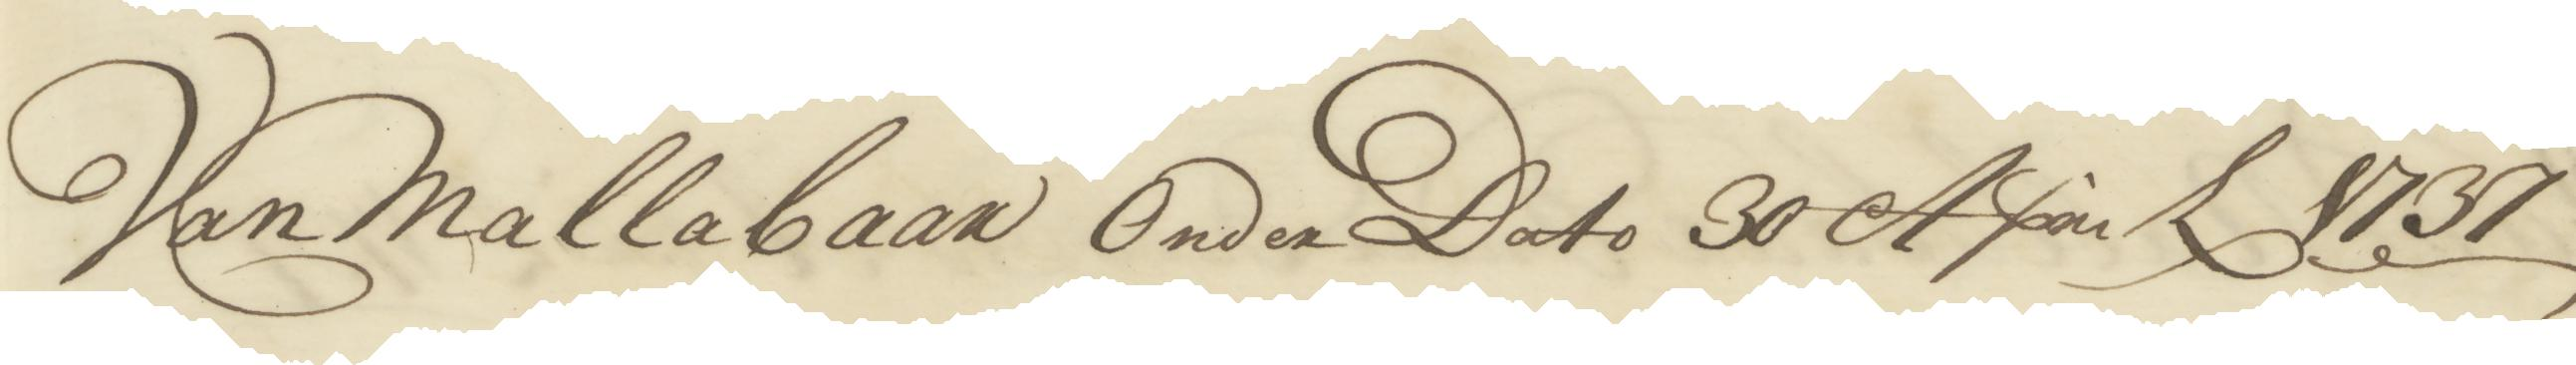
Van Mallabaar Onder Dato 30 April 1737
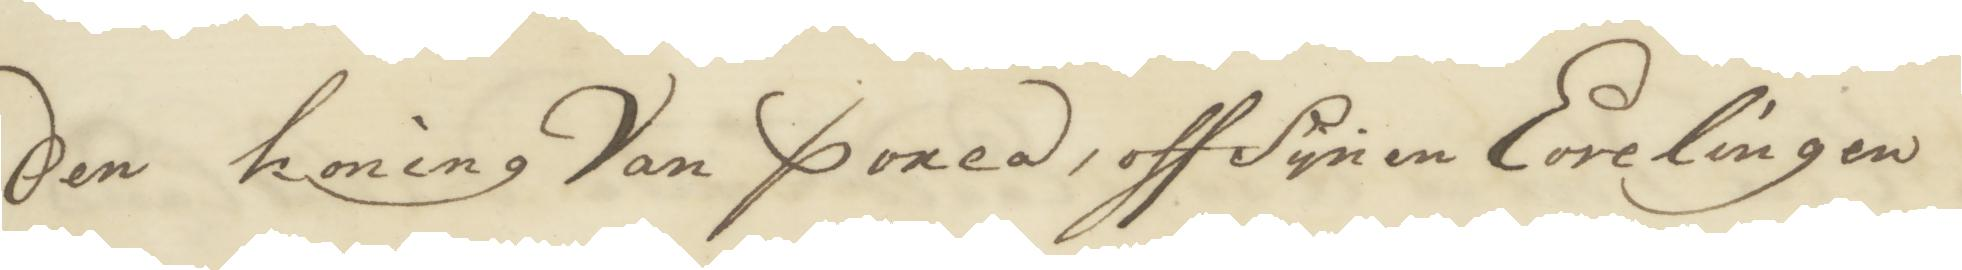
den koning van porca, off sijnen hovelingen
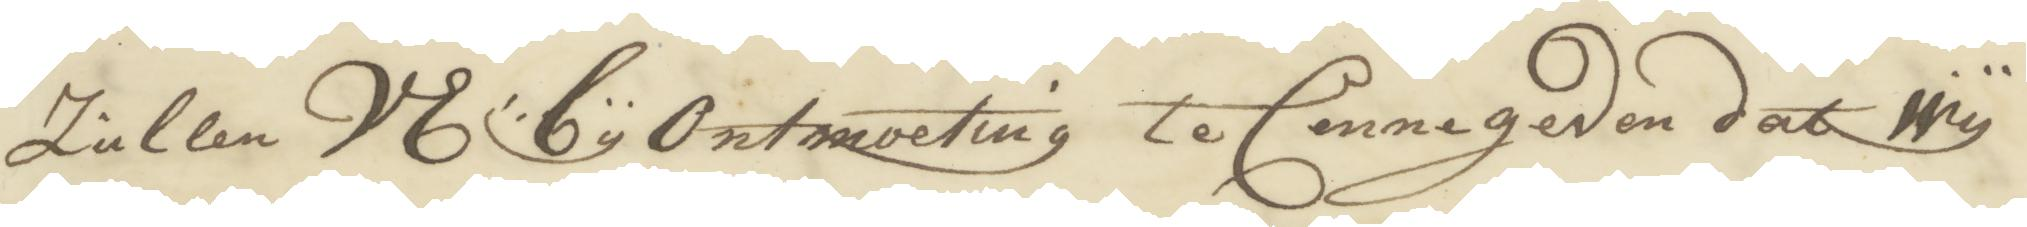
zullen VE: bij ontmoeting te Cenne geven dat wij
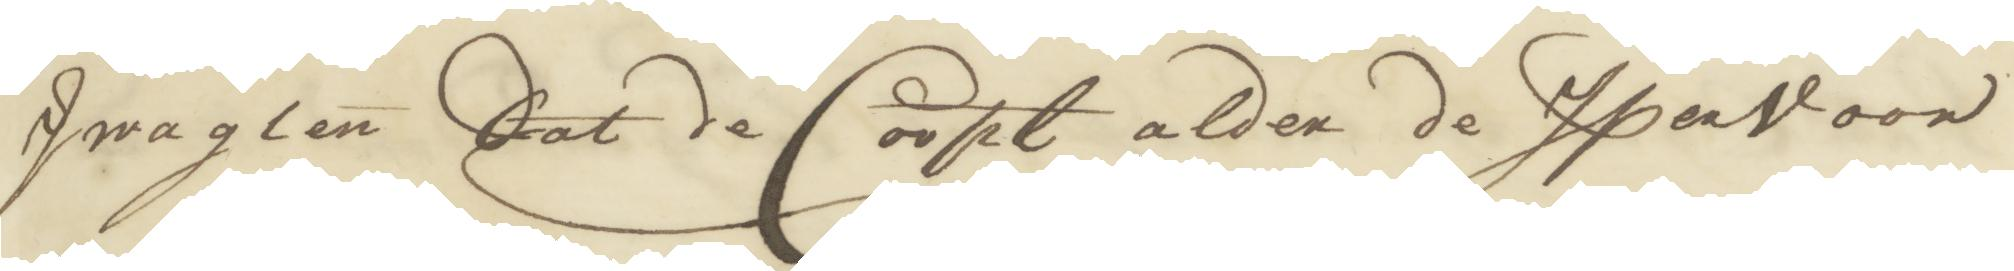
verwagten dat de Coopl alder de Jper voor
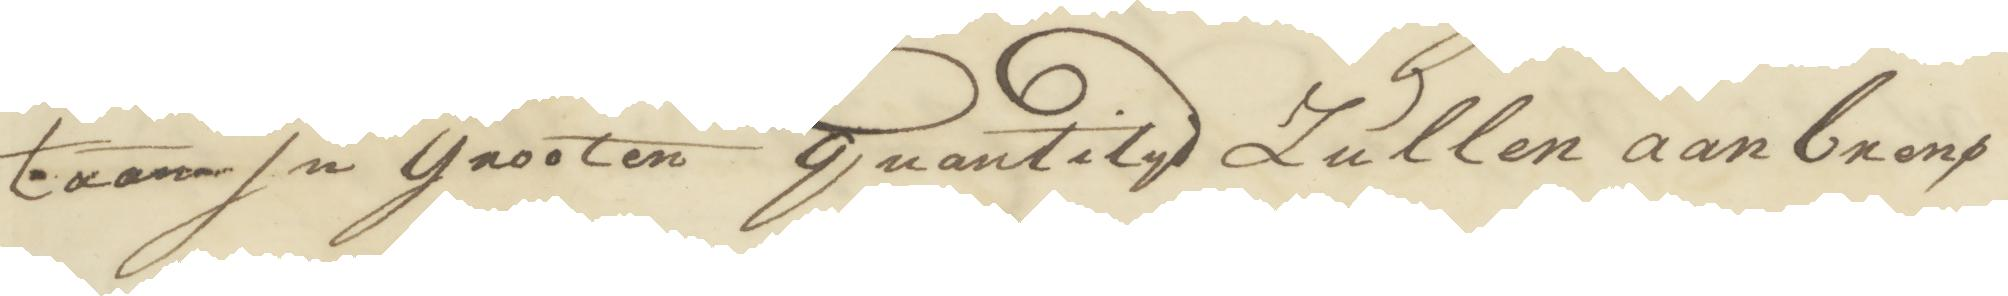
taan in grooten quantityd zullen aan breng
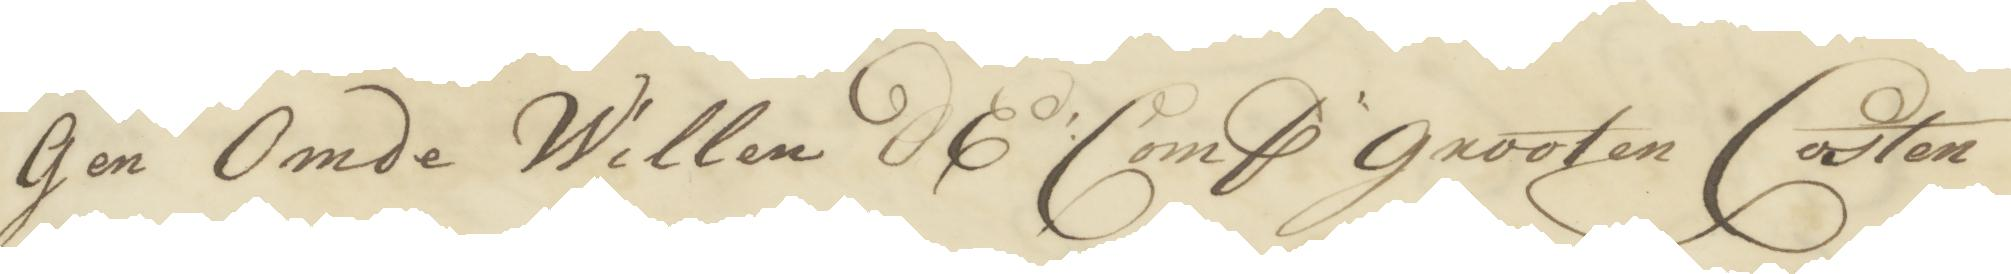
gen Omde Willen dE: Comps grooten Costen
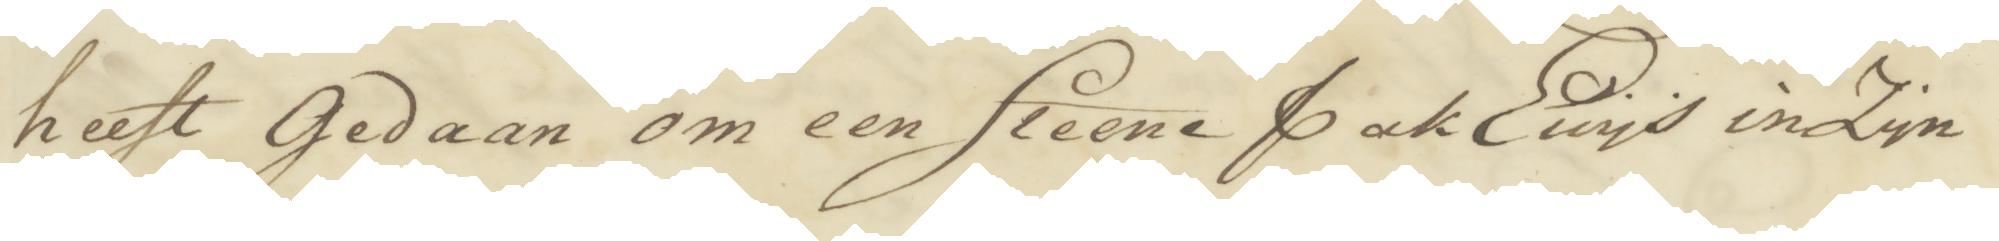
heeft gedaan om een steene pakhuijs in zijn
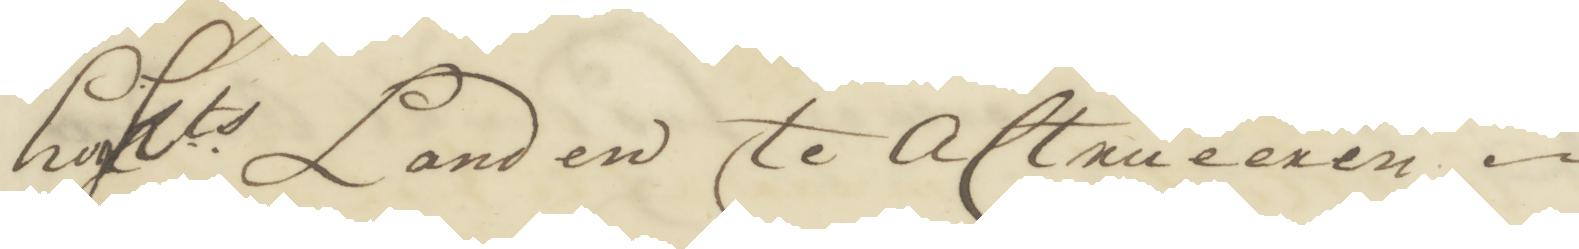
hoght:ts Landen te astrueeren —
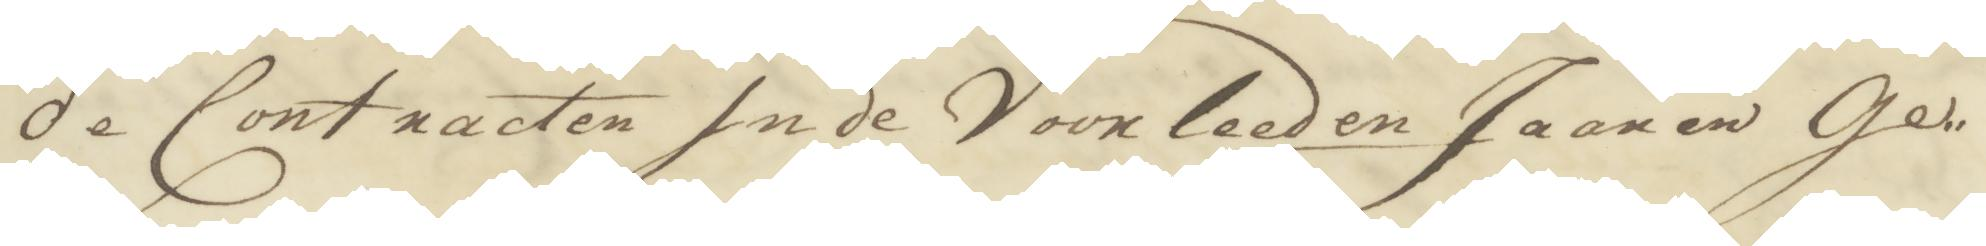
de Contracten in de voorleeden Jaaren ge„
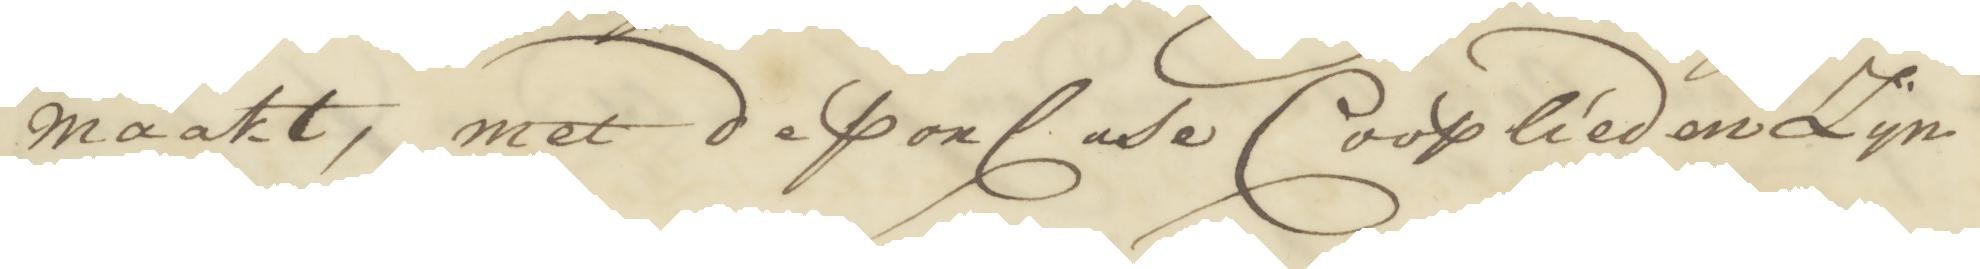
maakt, met de porcase Cooplieden zijn
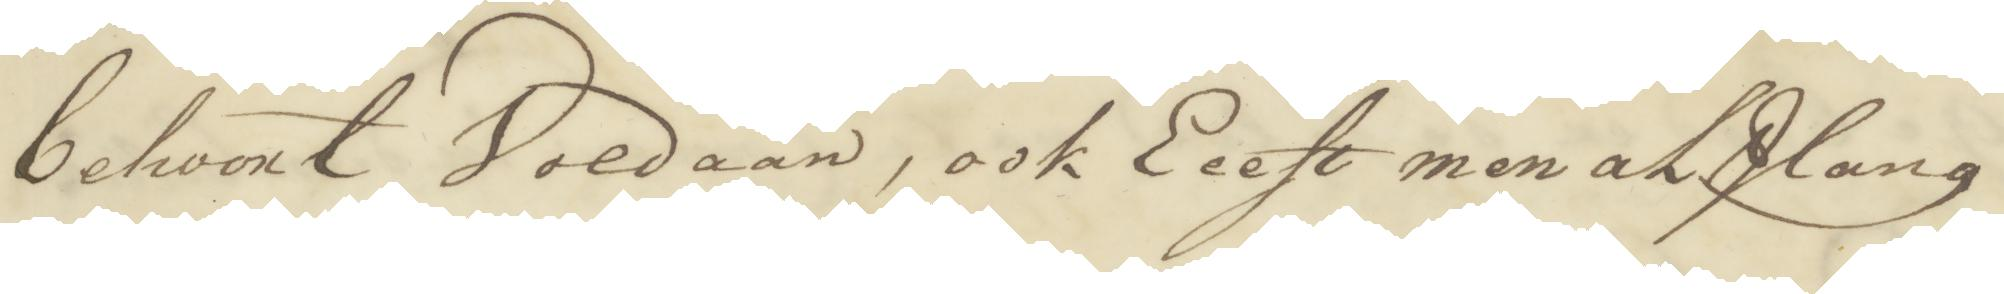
behoorl Voldaan, ook heeft men al verlang
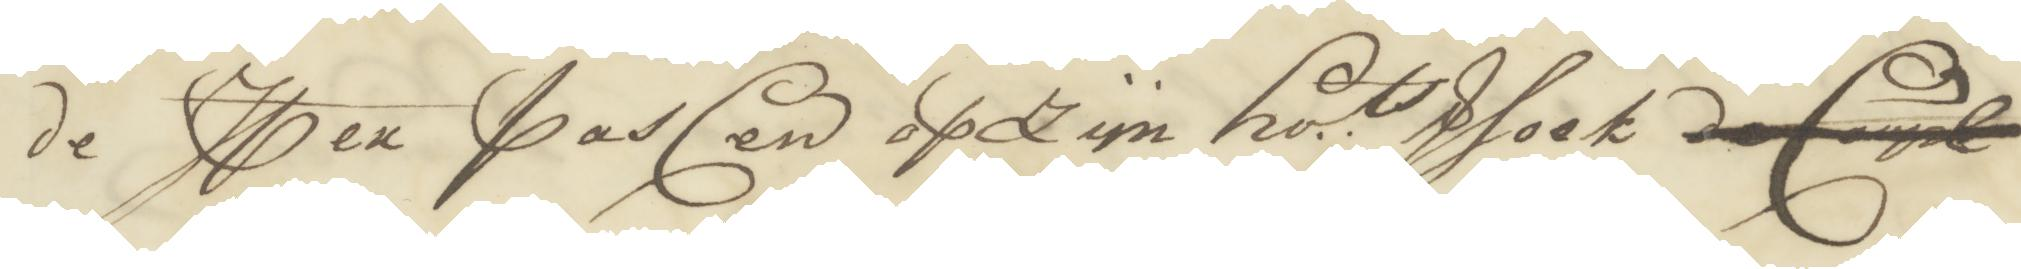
de Jper pascen op zijn ho:ts versoek de Coopl
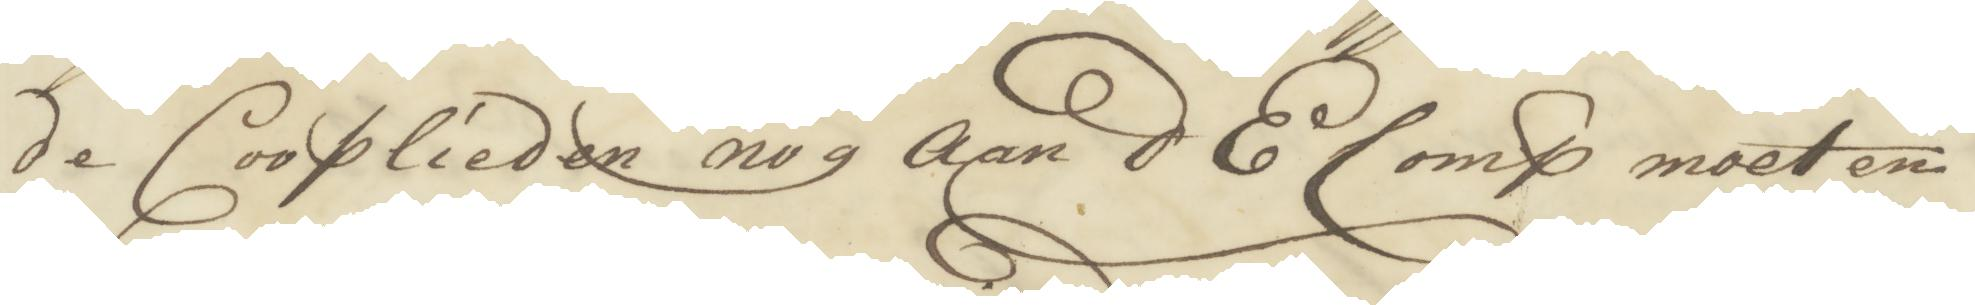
de Cooplieden nog aan d E Comp moeten
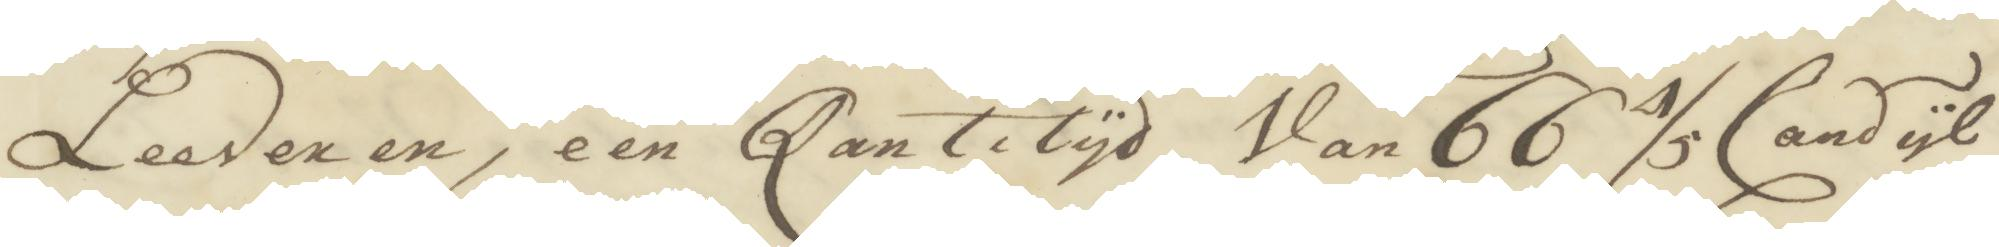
Leeveren, een Qantitijd van 66 4/5 Candijl
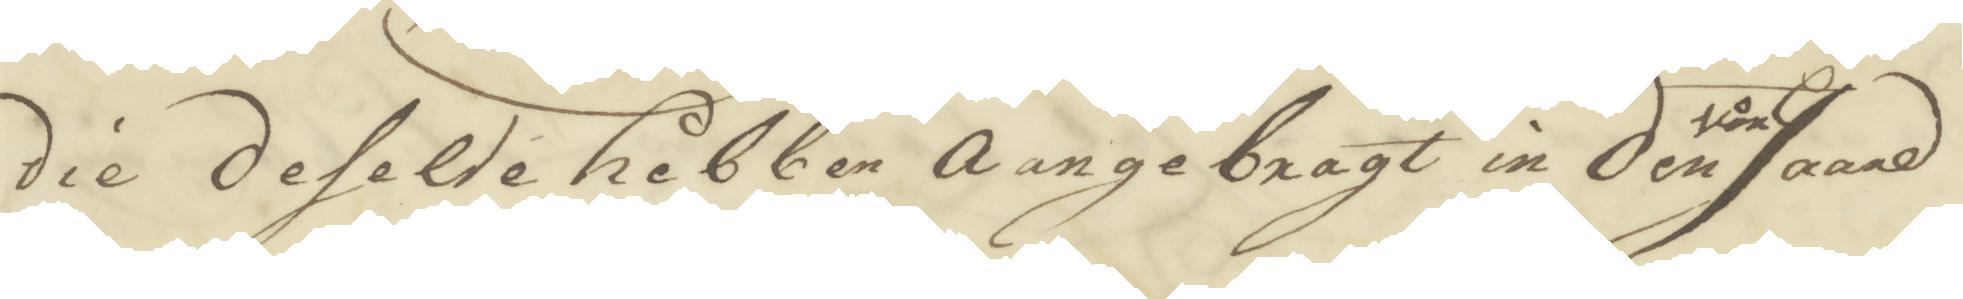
die deselve hebben aangebragt in den Jaare
